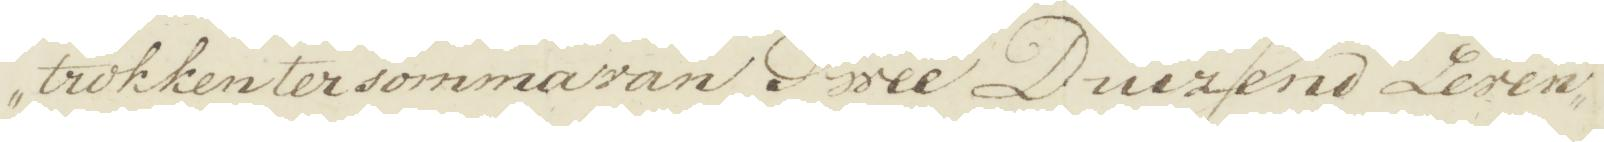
„trokken ter somma van Twee Duizend Zeven„
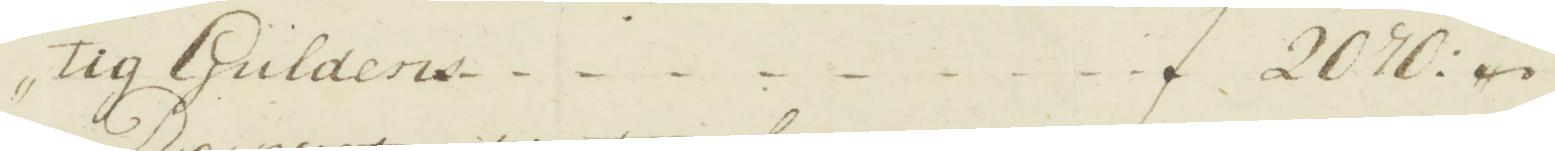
„tig Guldens. . . . . . . . . . ƒ 2070: —
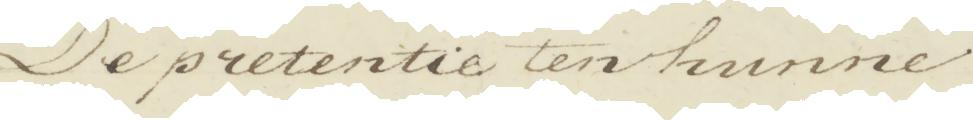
De pretentie ten hunne
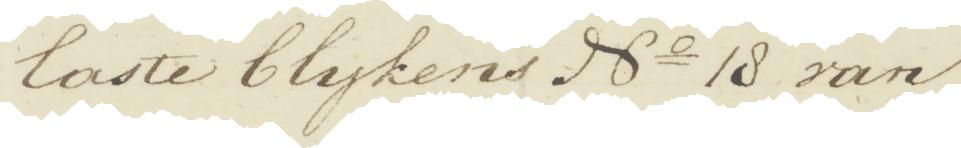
laste blijkens N=o 18 van
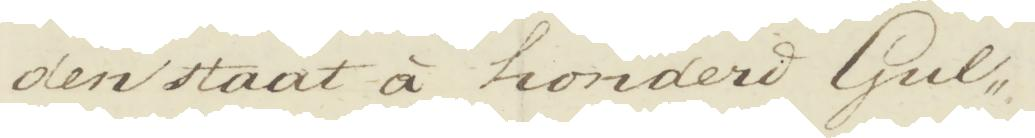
den staat à honderd Gul„
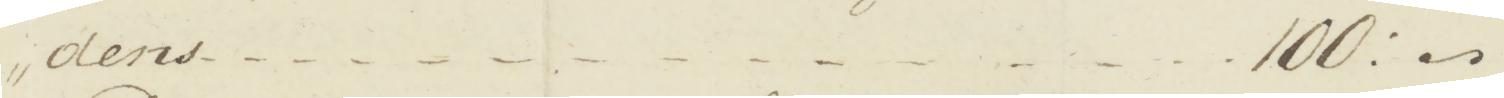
„dens . . . . . . . . . . . . . . . 100: —
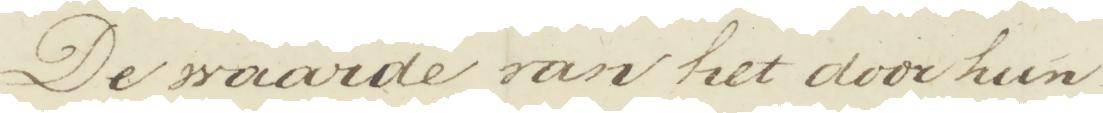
De waarde van het door hun
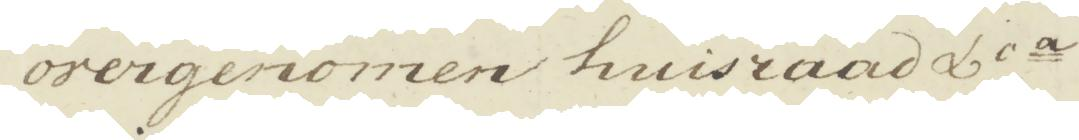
overgenomen huisraad & c=a
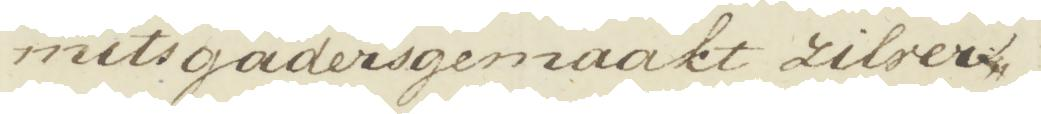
mitsgaders gemaakt zilver„
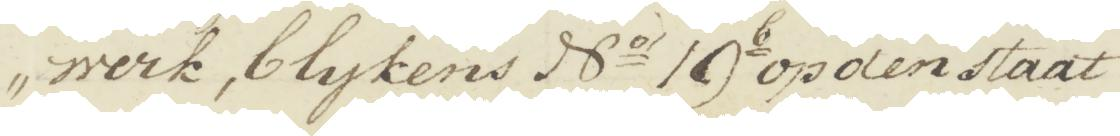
„werk, blykens N=o 19=b op den staat
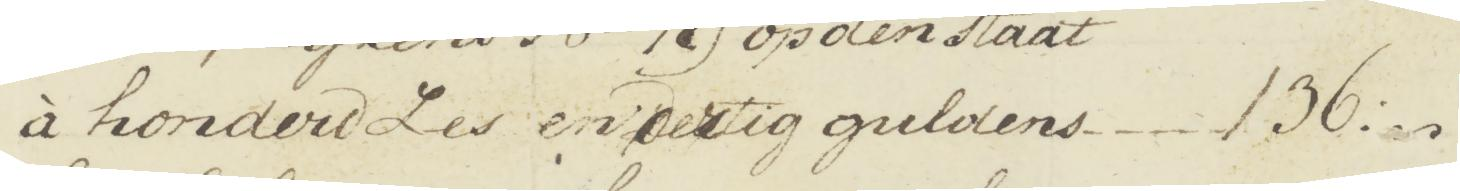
à honderd Zes en dertig guldens. . . . 136: —
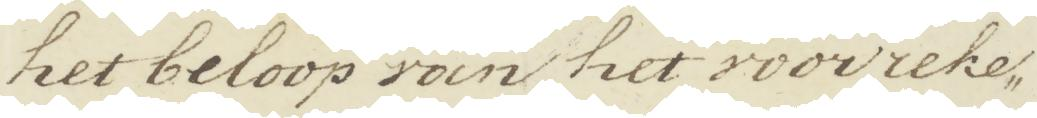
het beloop van het voorreke„
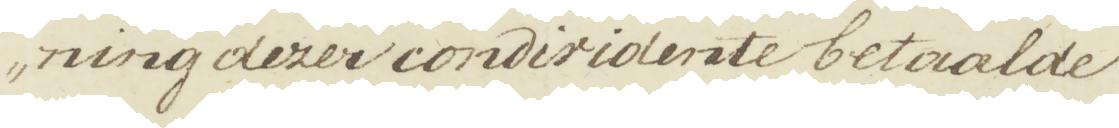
„ning dezer condividente betaalde
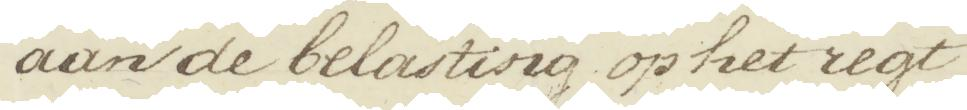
aan de belasting, op het regt
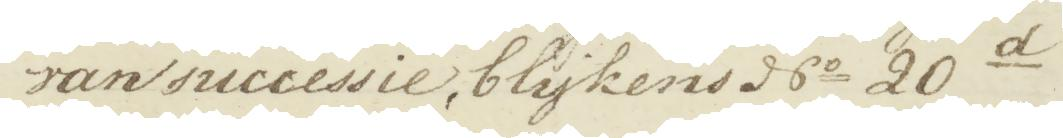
van successie, blykens N=o 20-d
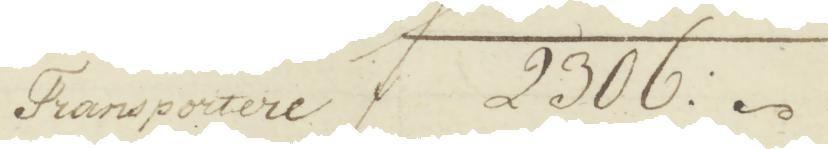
Transportere ƒ 2306: —
